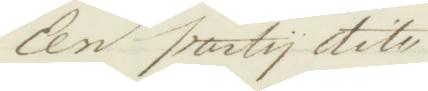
Een partij dito
